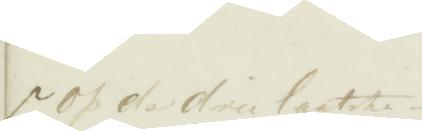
¶ op de drie laatste
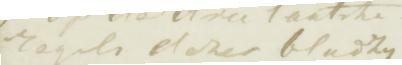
regels dezen bladzy
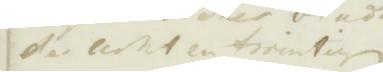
de acht en twintig
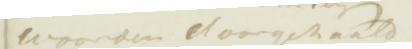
woorden doorgehaald
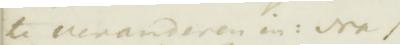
te veranderen in: Na
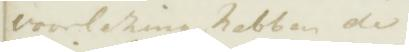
voorlezing hebben de
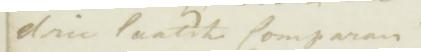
drie laatst Comparan
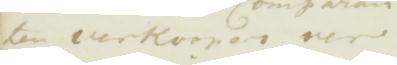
ten verkoopers ver
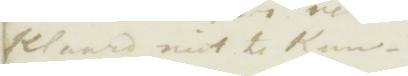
Klaard niet te Kun-
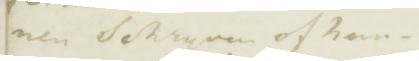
nen Schrijven of han-
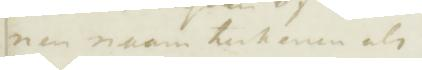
ren naam teekenen als
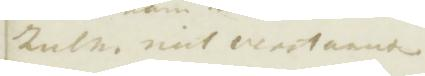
Zulks niet verstaande
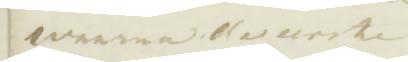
waarna de eerste
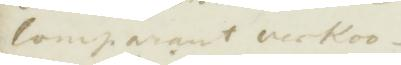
Comparant verkoo
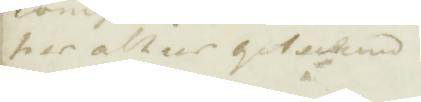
per alhier geteekend
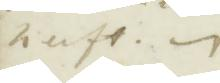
heeft.—
